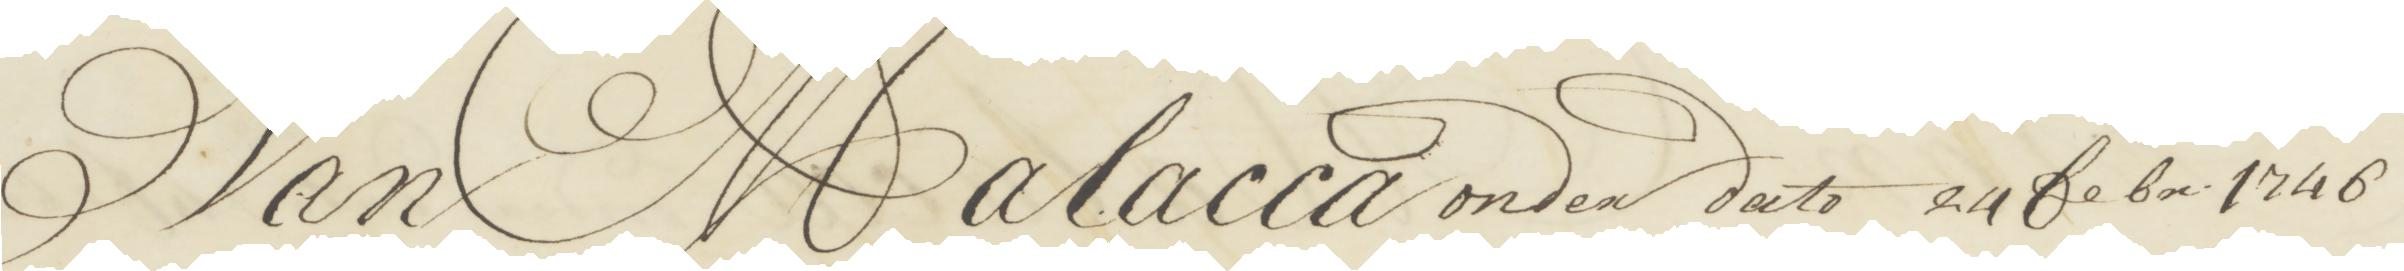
Van Malacca onder dato 24 febr 1746
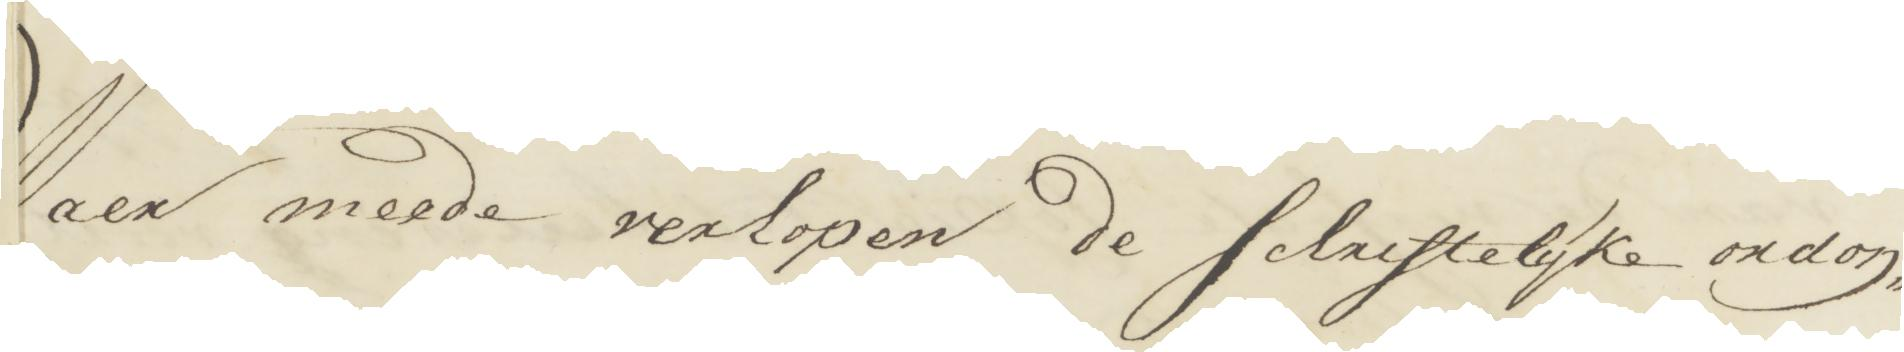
Waer meede verhopen de schriftelijke orden„
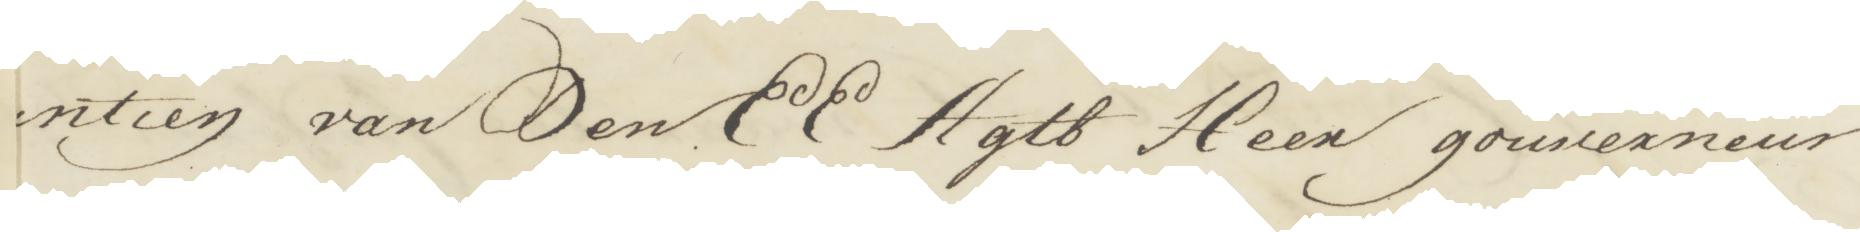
ntien van Den E E Agtb Heer gouverneur
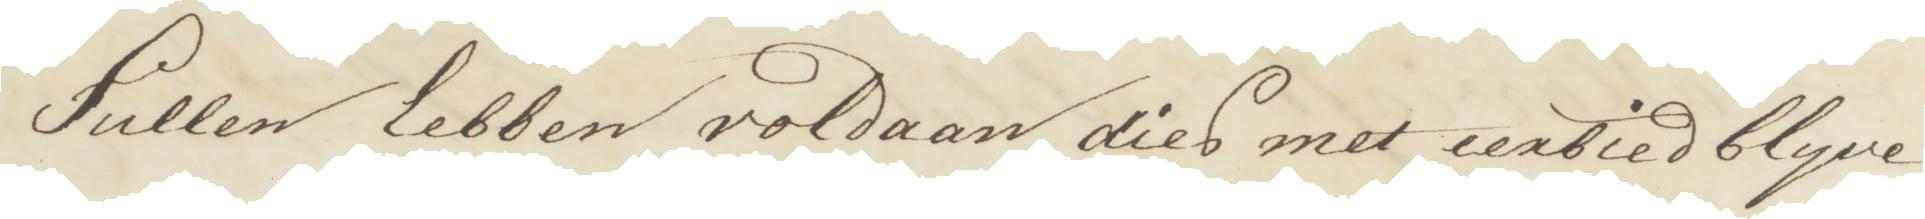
Sullen hebben voldaan dies met eerbied blyve
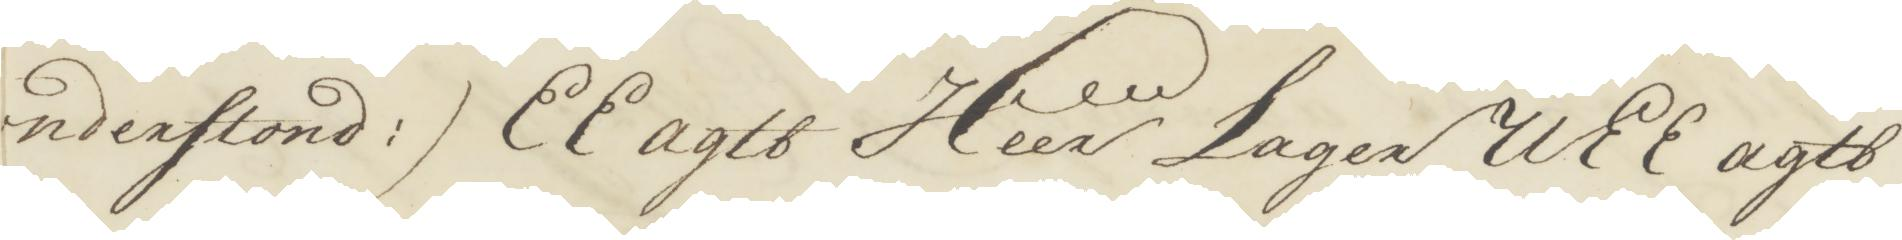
nderstond :/ E E agtb Heer Lager UE E agtb
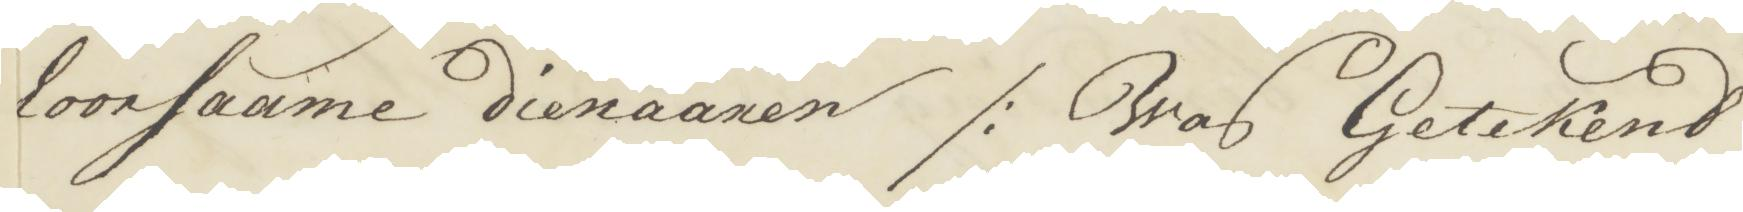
hoorsaame dienaaren /: was Getekend
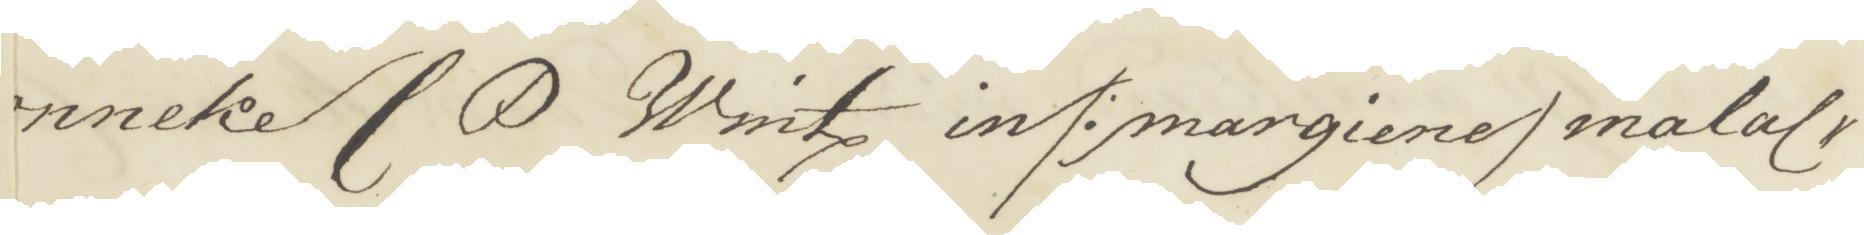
nneke C D Wint in /: margiene / malac
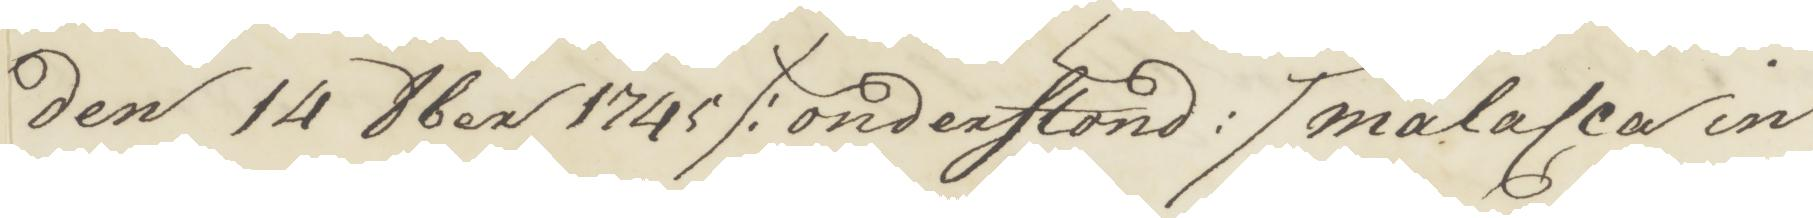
den 14 8ber 1745 /: onderstond :/ malacca in
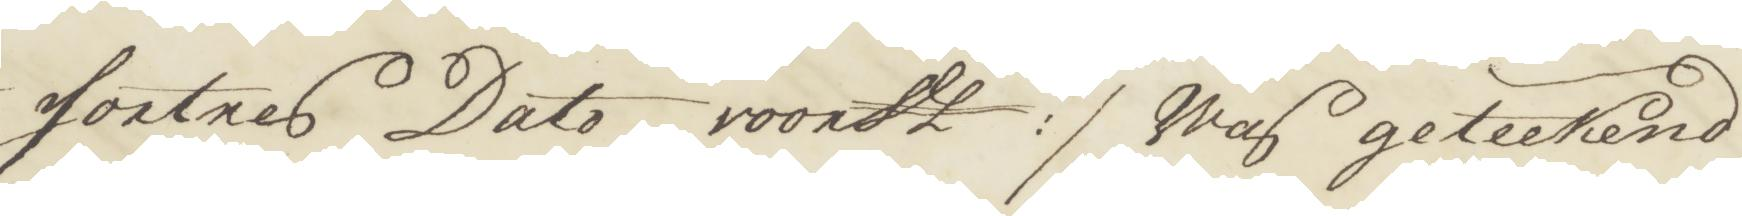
fortres Dato voorsz :/ was geteekend
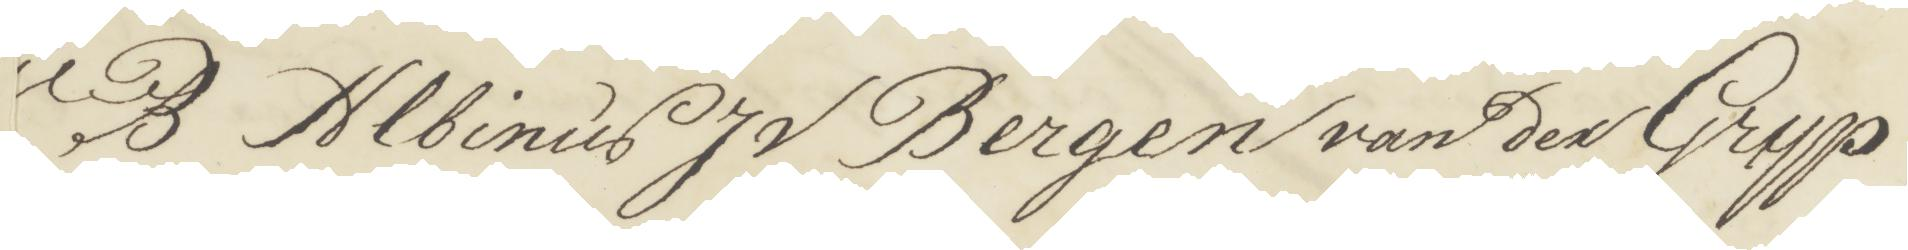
B Albinus J v Bergen van der Gryp
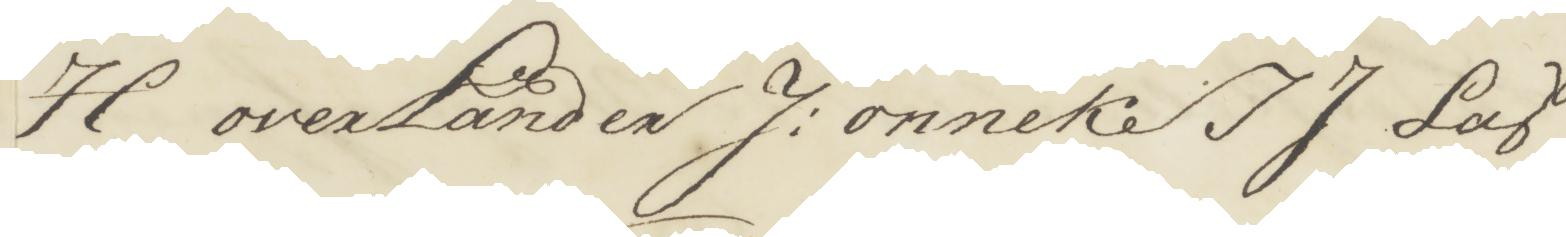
H overlander J:onneke I J Sas
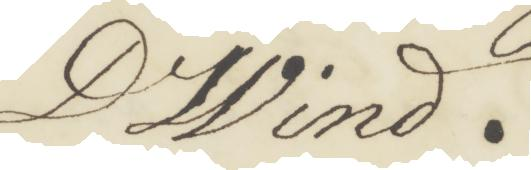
D Wind
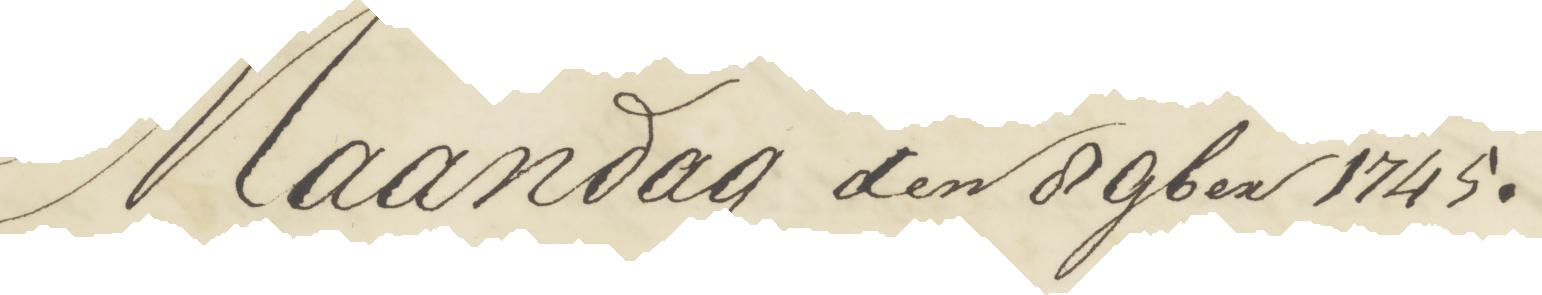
Maandag den 8 9ber 1745.
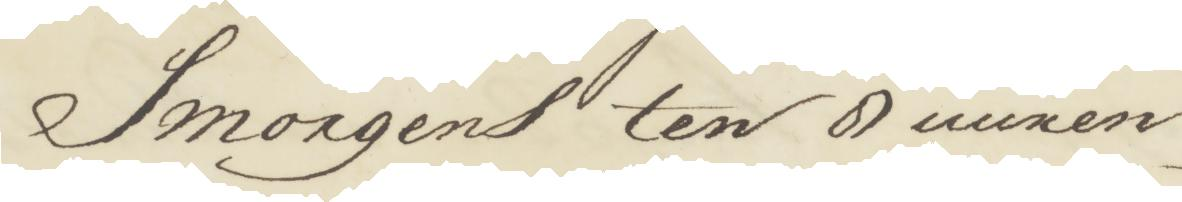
S morgens ten 8 uuren
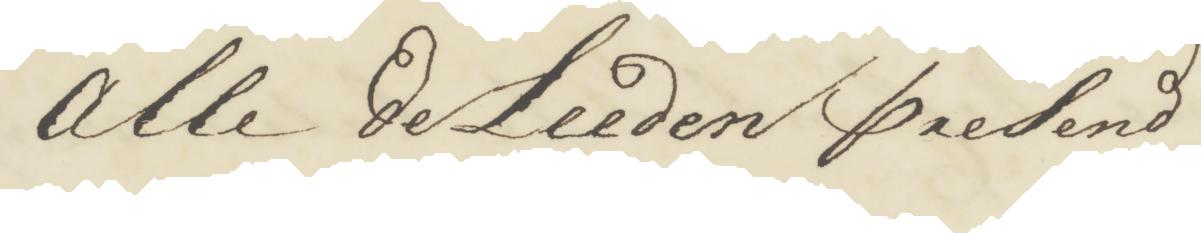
alle de Leeden presend
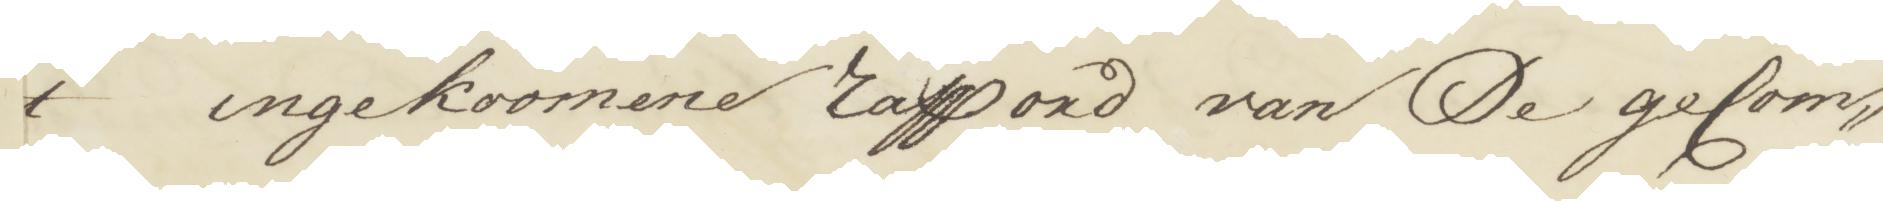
t ingekoomene rappord van De gecom„
